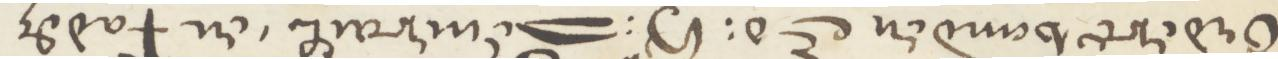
Ordere vanden Ed: H:r Generael, en Raden
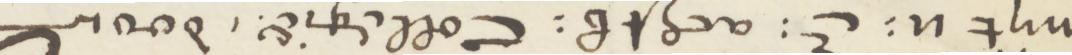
uijt u: E: achtb:r Collegie, door
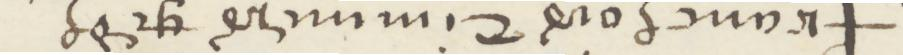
Franchois Timmers gedh
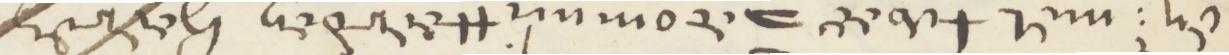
ey:r met twee Gecommitteerden heeren
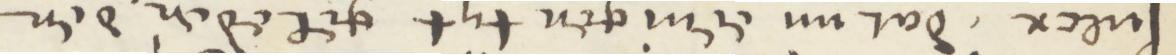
sulcx, dat nu eenigen tijt geleden, den
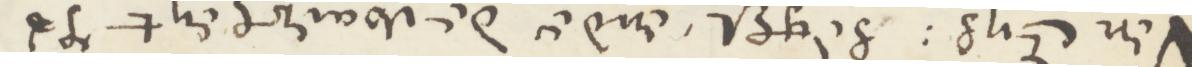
Den Eys:r seght, ende de waerheijt Is
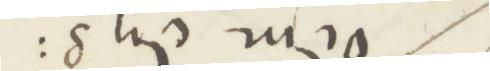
Jdem Eijs:r
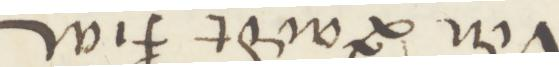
Den Raedt fiat
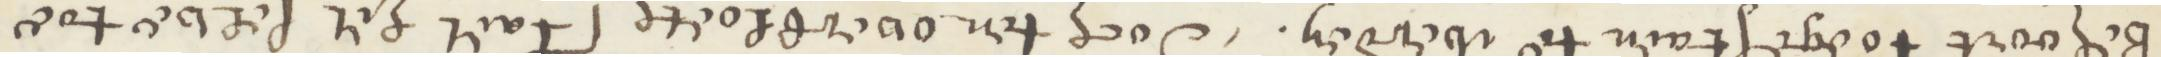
behoort toegestaen te werden. Doch ten overbloeten staet het selve toe,
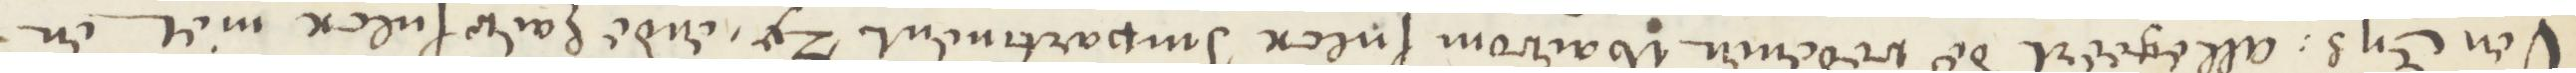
Den Eijs:r allegeert de redenen waerom sulcx Impartinent zij, ende haer sulcx niet en
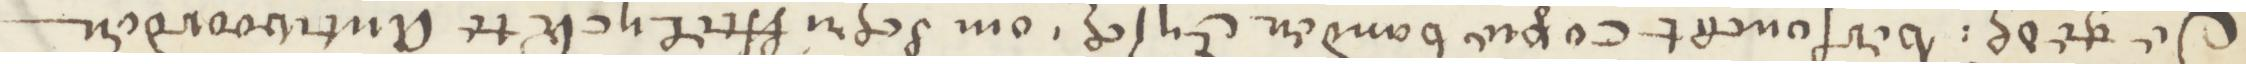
De gedh:e versonckt copie vanden Eysch, om schrifftelijck te antwoorden
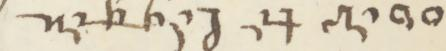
over te leggen
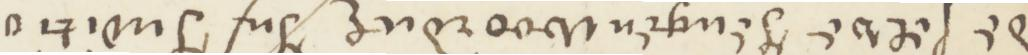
de selve Iengenwoordich In Iuditio
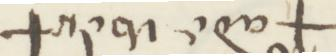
Rade wert
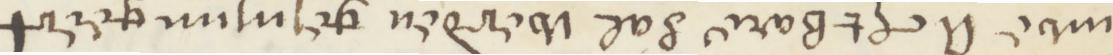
uwe Achtbare sal werden gejniungeert
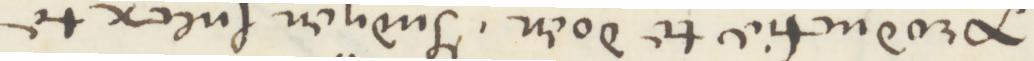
productie te doen, Indijen sulcx te
